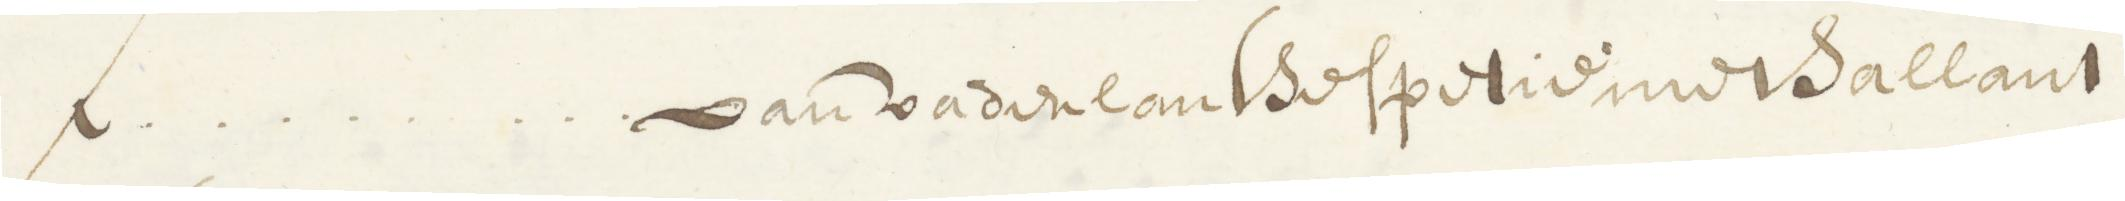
ƒ . . . . . . . . van vaderlantse spetie met Sallant
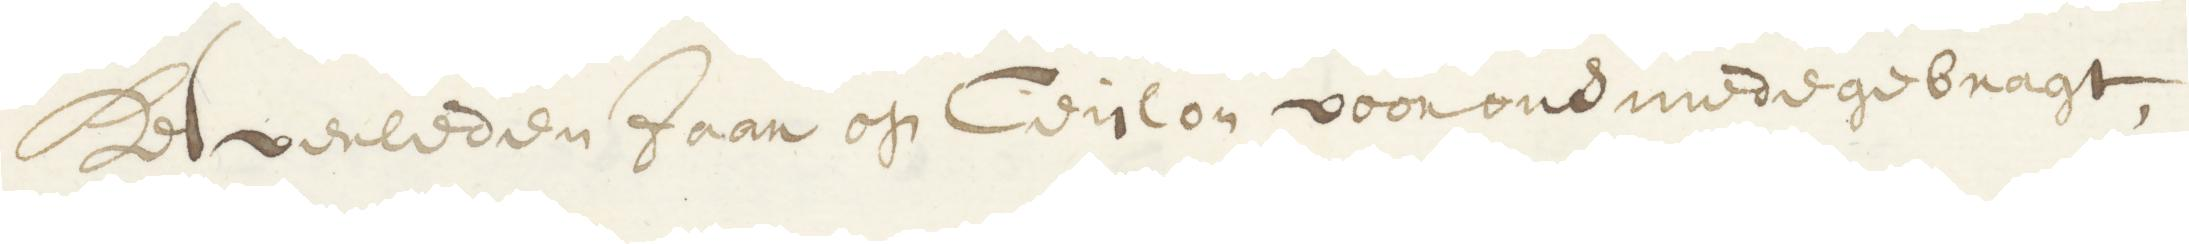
Het verleden Jaar op Ceijlon voor ons mede gebragt,
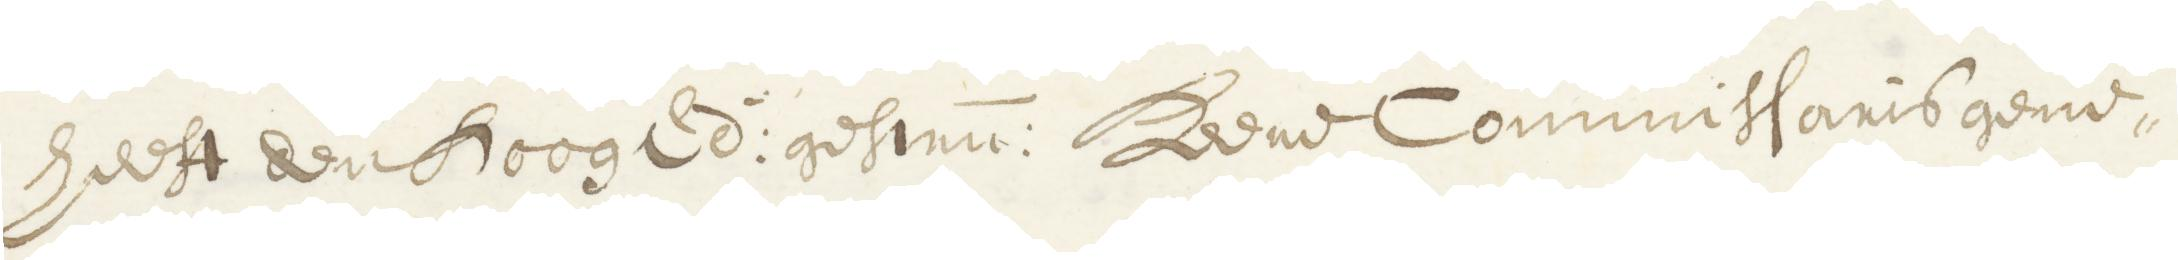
heeft den Hoog Ed: gestrn: Heere Commissaris gene„
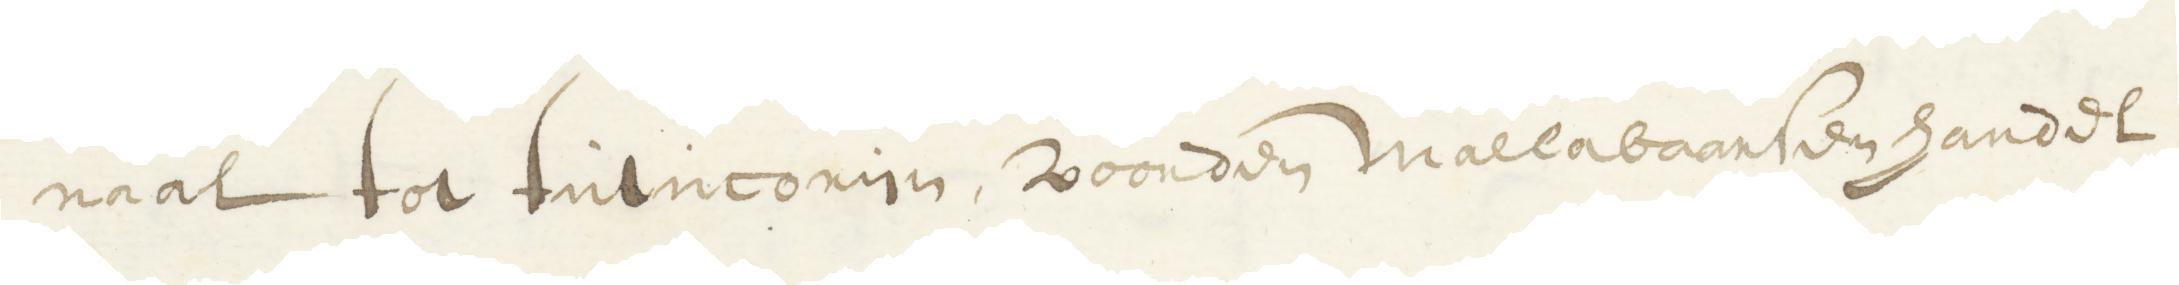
raal tot tutucorijn, voor den mallabaarsen handel
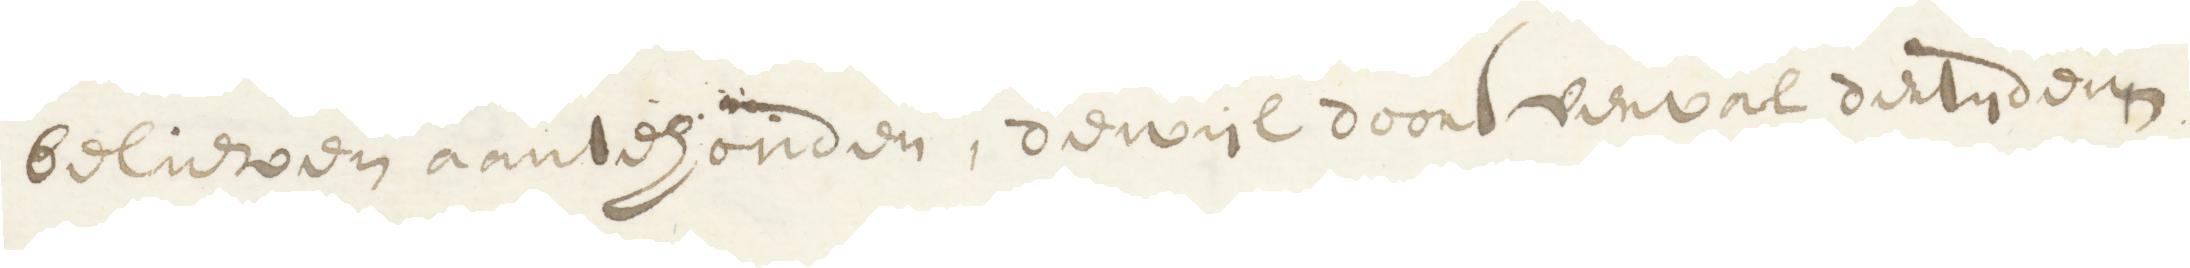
believen aantehouden, dewijl doort verval dertyden,
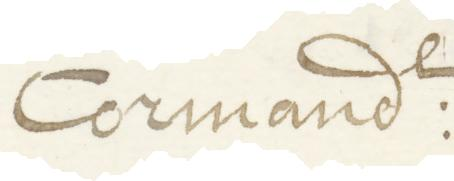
Cormand:l
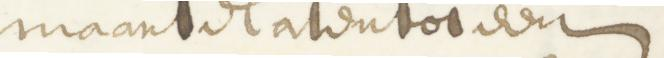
maar te laten tot een
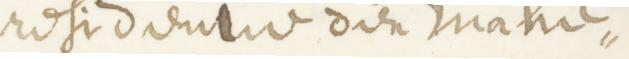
residentie der make„
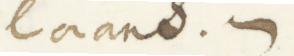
laars.-
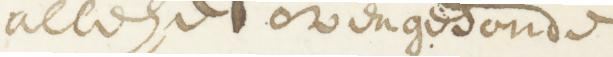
alle het overgesonde
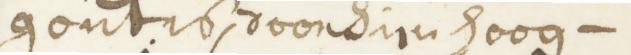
gout is door sijn hoog -
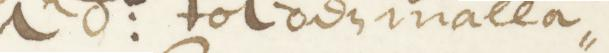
Ed:t tot den malla„
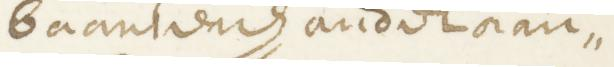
baarseren handel aan„
